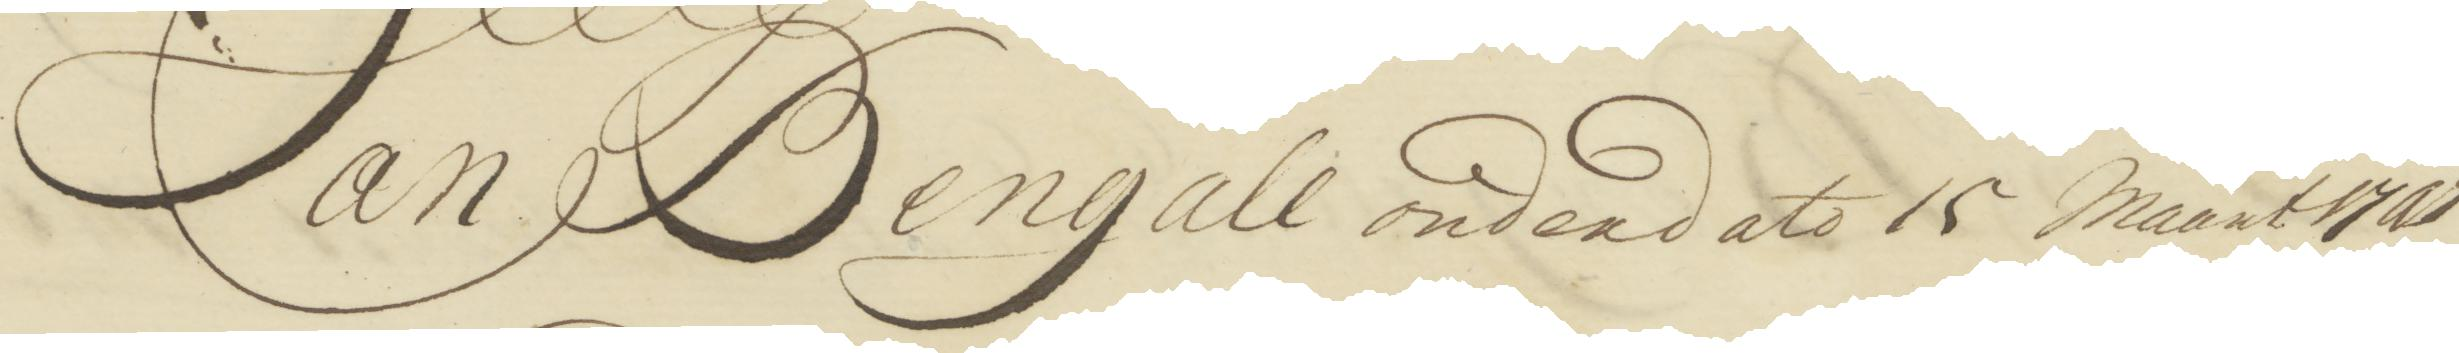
Van Bengale onder dato 15 Maart 1747
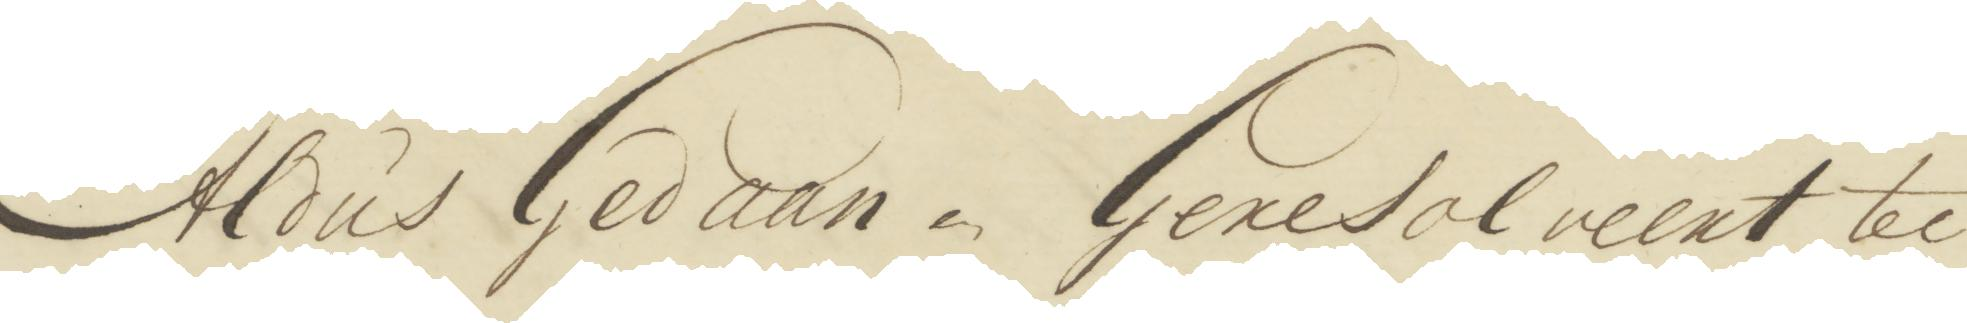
Aldus Gedaan en Geresolveert te
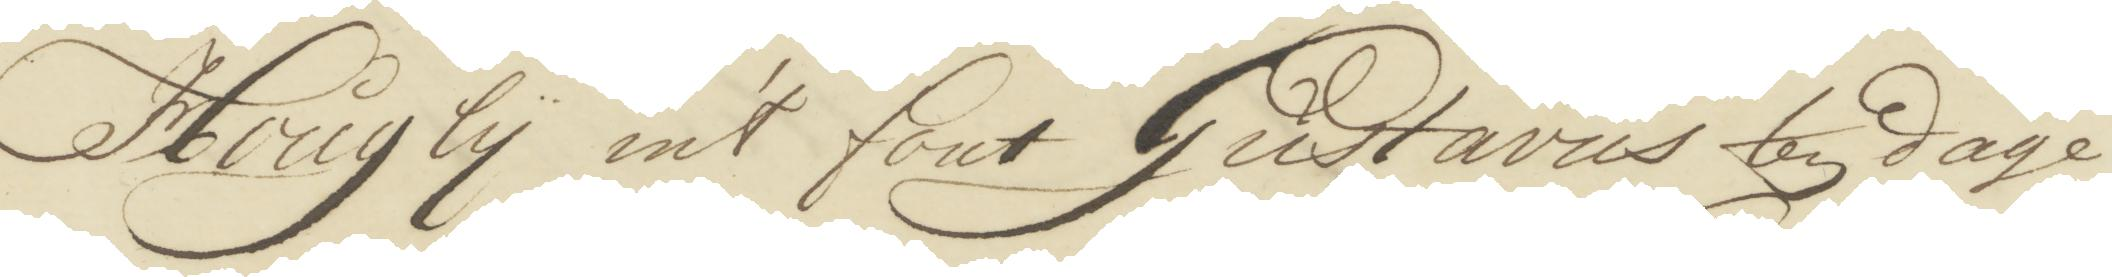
Houglij in't fort Gustavus ten dage
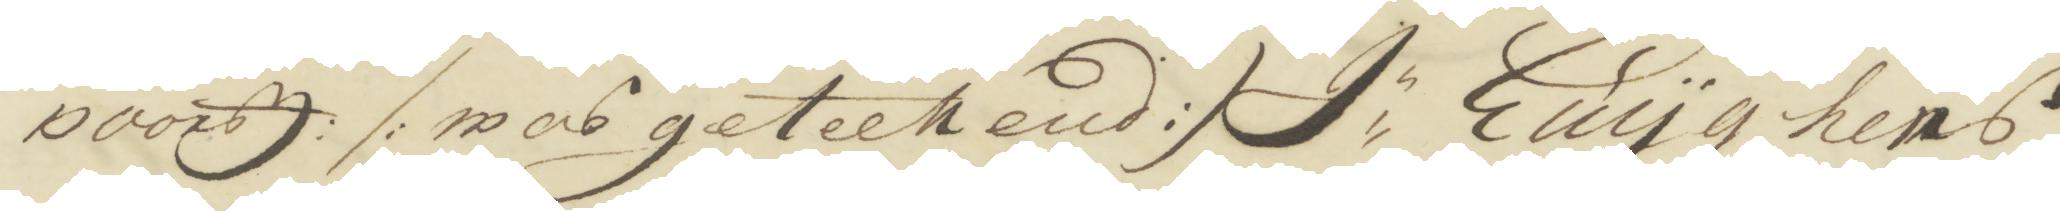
voorsz: /:was geteekend:/ J„n huijghens,
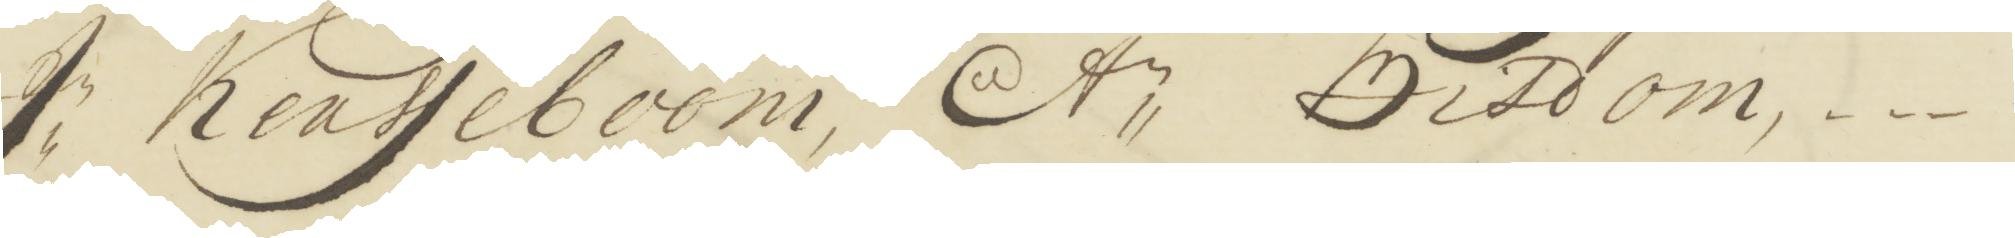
J„n Kersseboom, A„n Bisdom, - - -
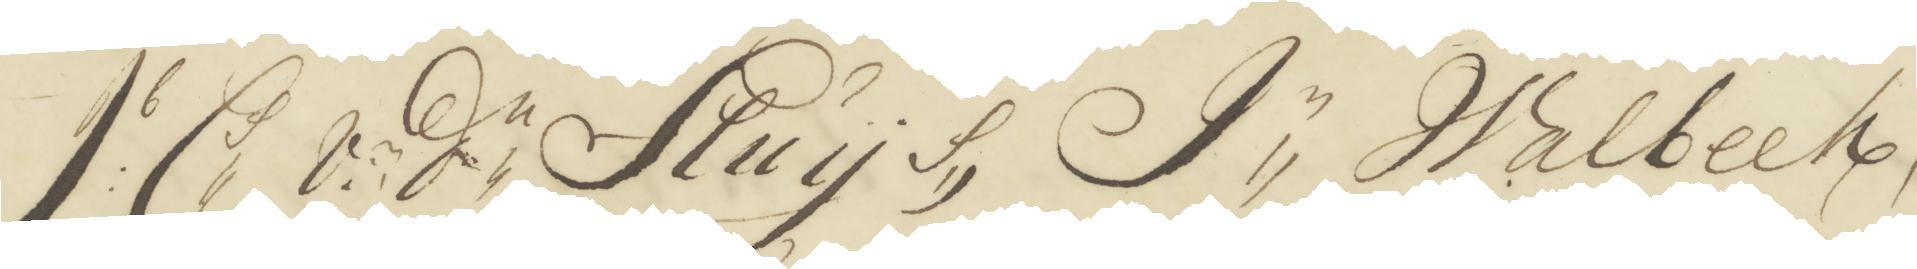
J:s C„s v:n d„r Sluijs„ J„n Walbeek,
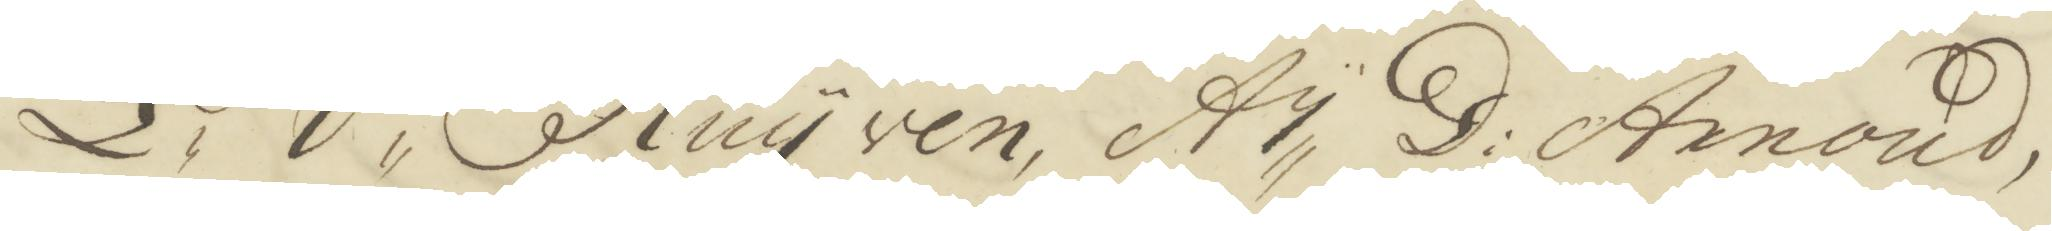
T„ V„n Ruijven, Aij„ D: Arnoud,
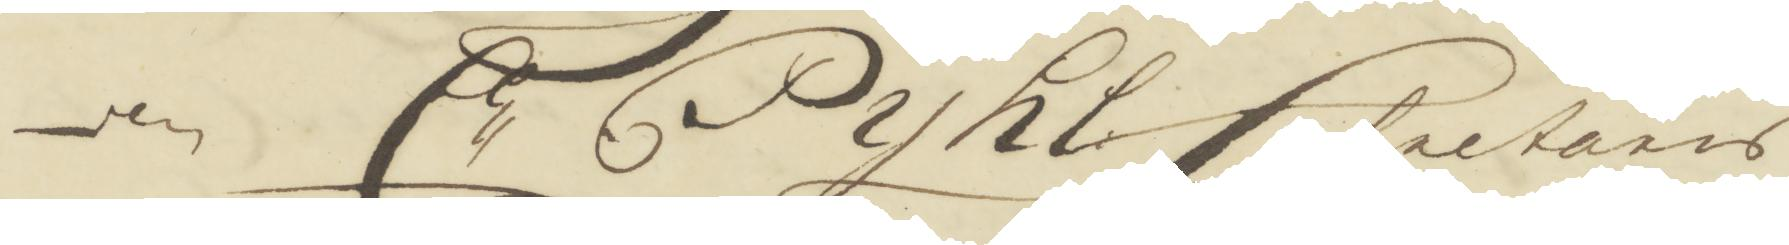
_en C„l Pyhl secretaris
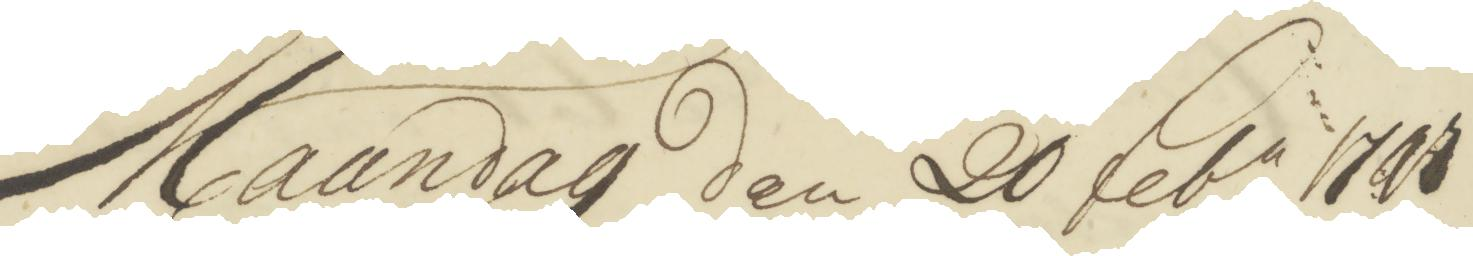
Maandag den 20 feb„r 1747
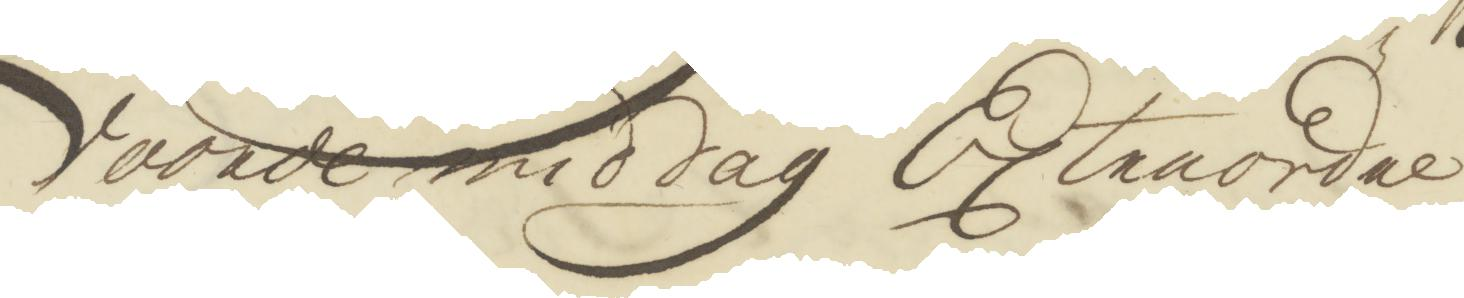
voorde middag Extraordre
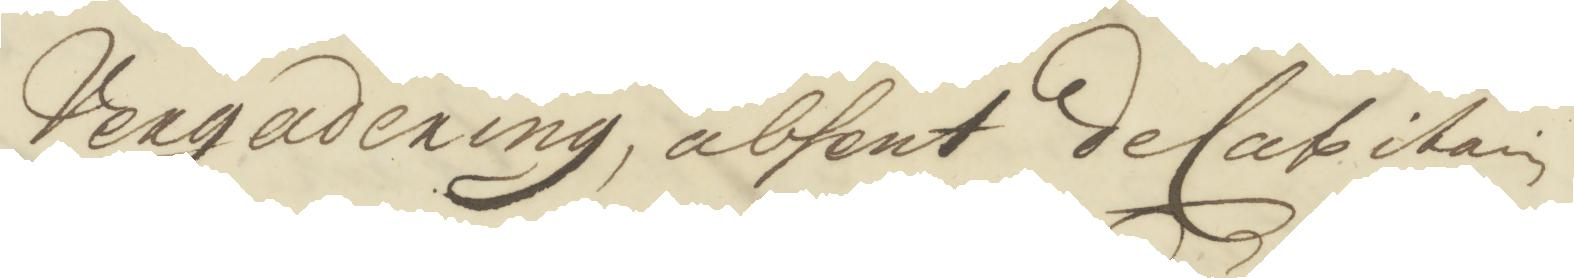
Vergadering, absent de Capitain
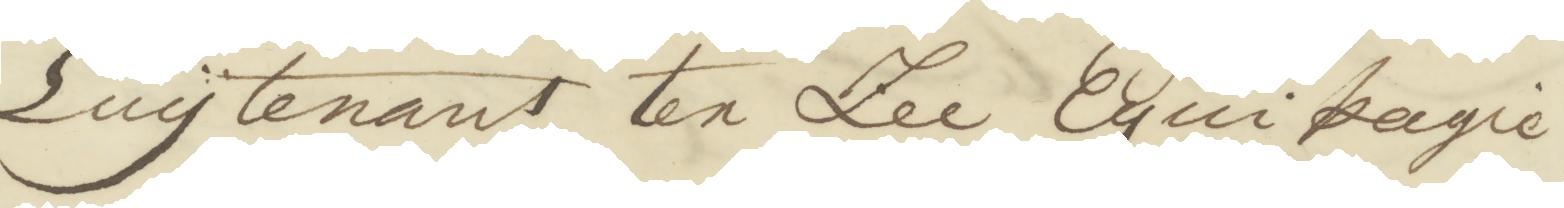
Luijtenant ter zee Equipagie
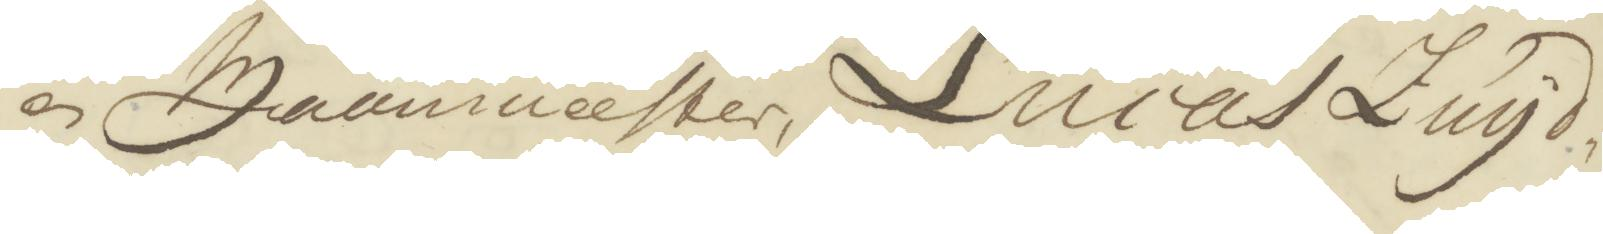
en baanmeester, Lucas Zuijd„
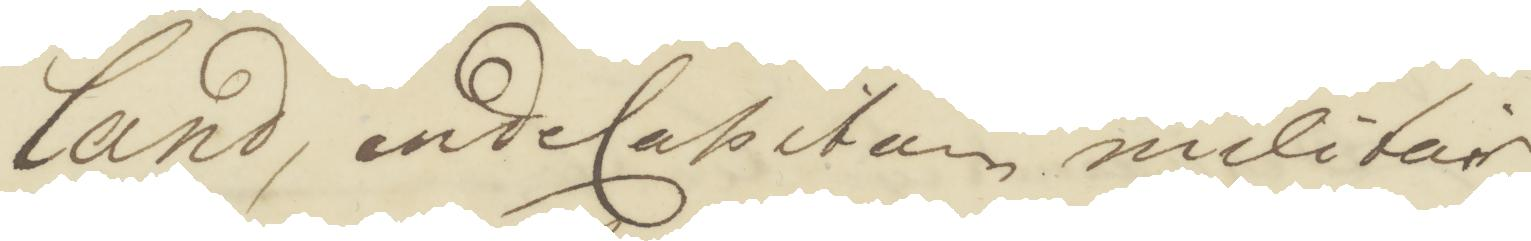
land, en de Capitain militair
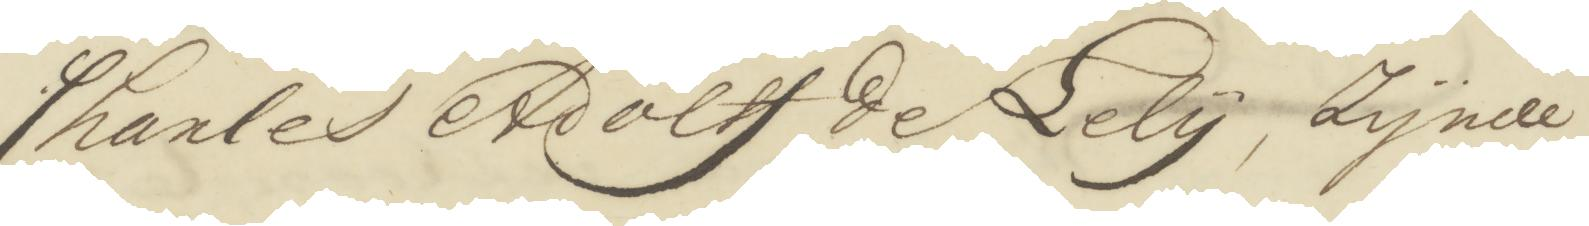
Charles Adolff de Lelij, zijnde
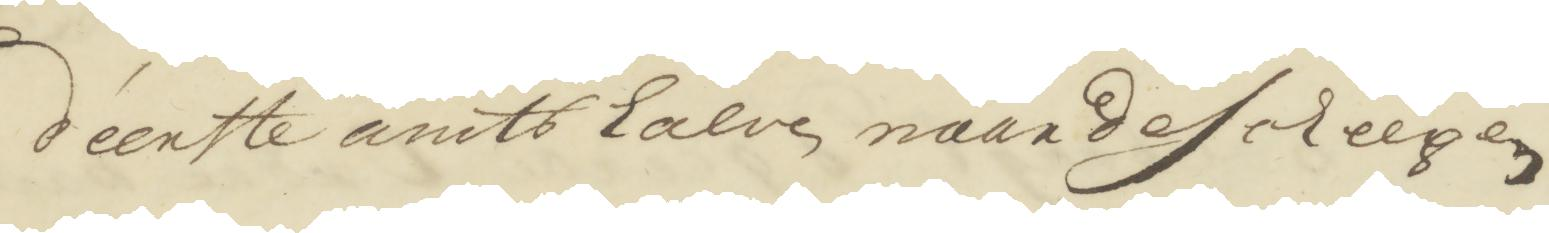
d’ eerste amts halven naar de scheepen
